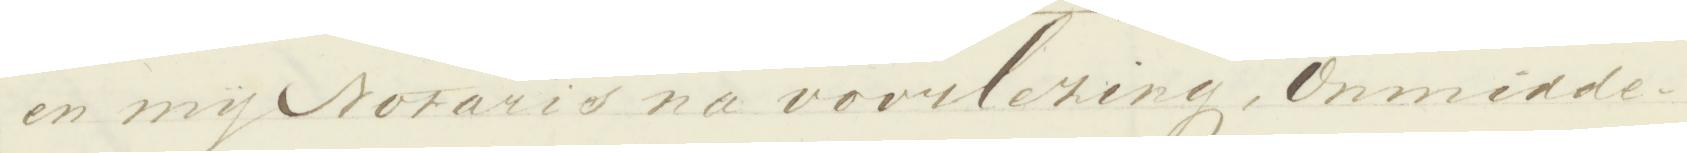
en mij Notaris na voorlezing, Onmidde-
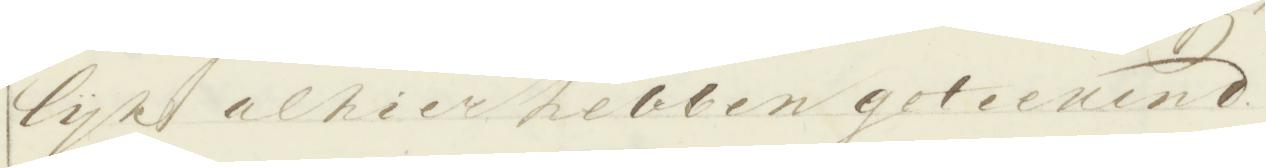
lijk alhier hebben geteekend.
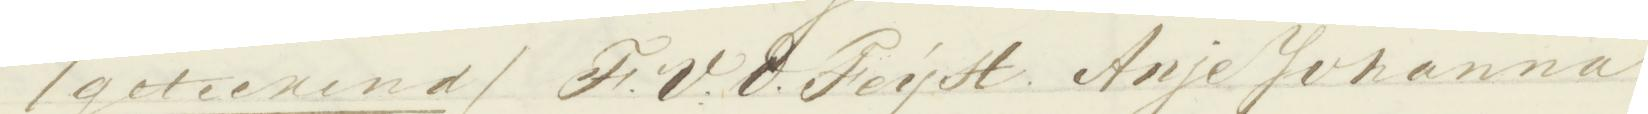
/geteekend/ F. V: D. Feijst: Anje Johanna
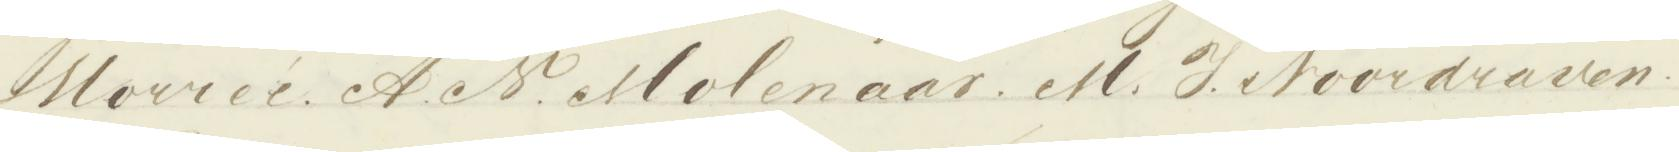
Morreé A.N. Molenaar. M.I. Noordraven
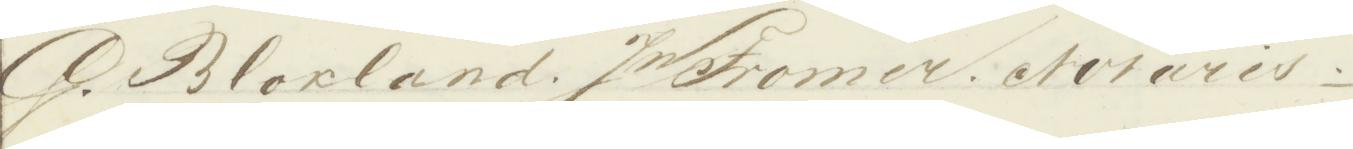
G. Blokland. Jr Fromer, Notaris.—
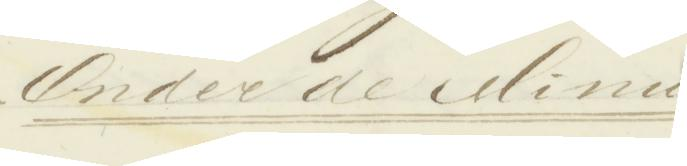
Onder de Minu
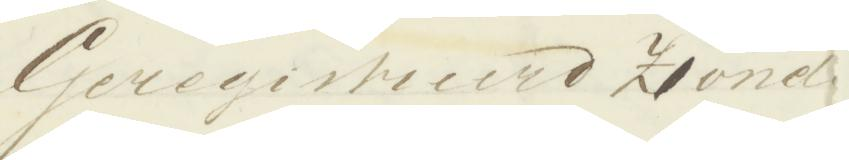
Geregistreerd Zond
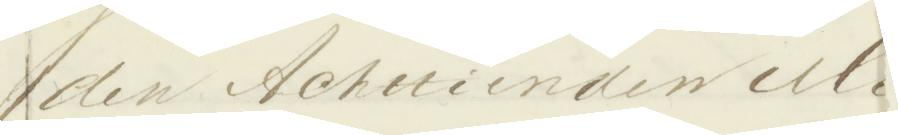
den Achttienden M
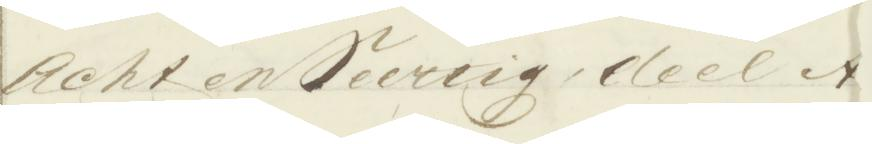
Acht en Veertig, deel A
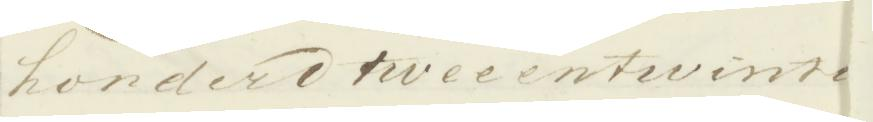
honderd twee entwinti
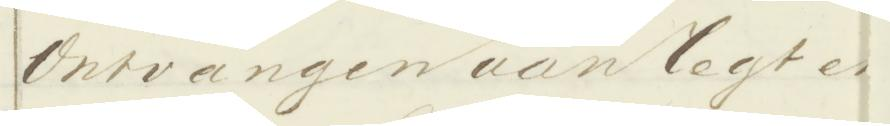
Ontvangen aan Regt en
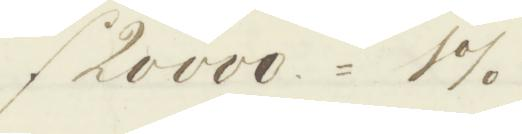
ƒ 20000. = 1%
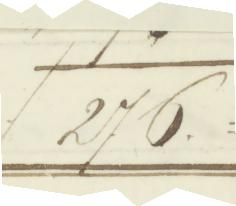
ƒ 276.
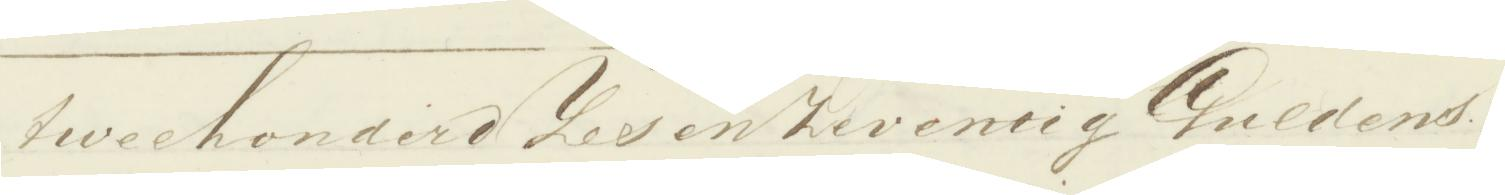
tweehonderd Zes en zeventig Guldens.
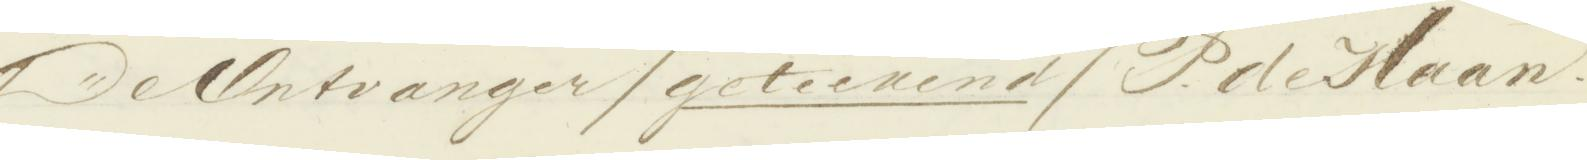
De Ontvanger /geteekend/ P. de Haan
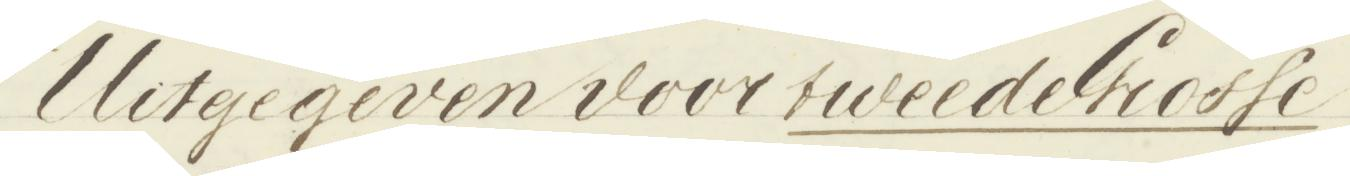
Uitgegeven voor tweede Grosse
